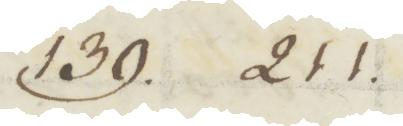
139. 211.
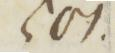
501.
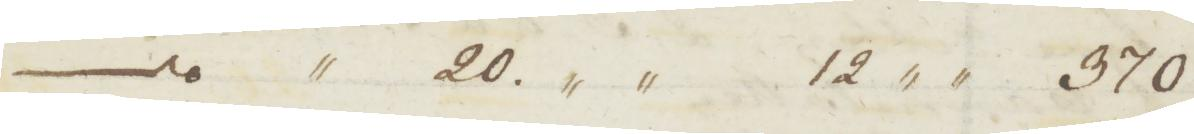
_o „ 20. „ „ 12 „ „ 370
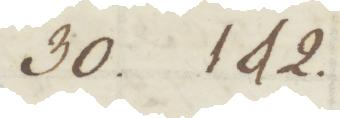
30. 142.
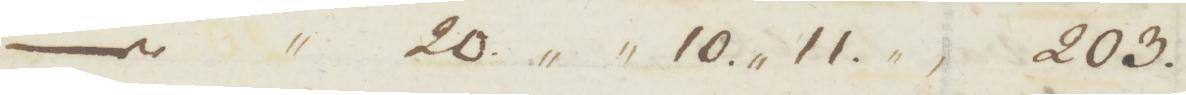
_o „ 20. „ „ 10.„ 11. „ , 203.
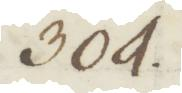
304.
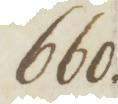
660.
